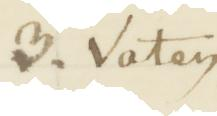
3. Vaten
